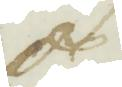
d_o
